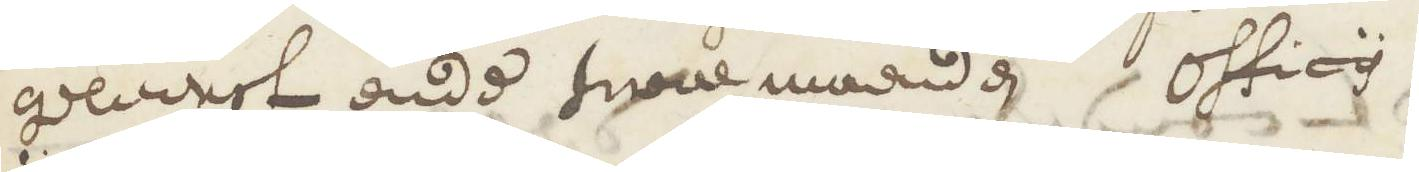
geleerst ende twee maenden officij
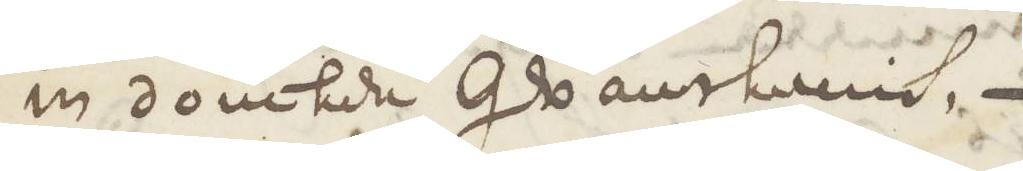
in doncker gevanckenis.—
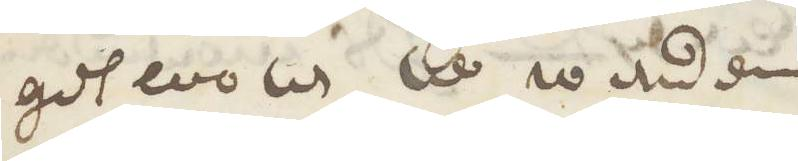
geslooten te werden
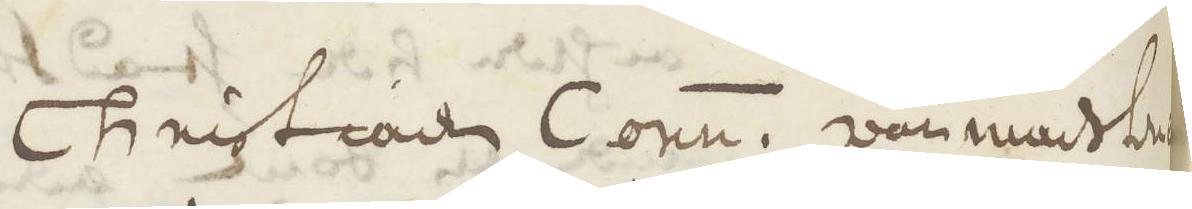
Christiaen Corn. van maesl
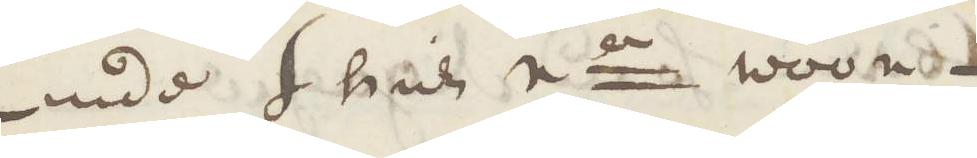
ende thien r=en voor -
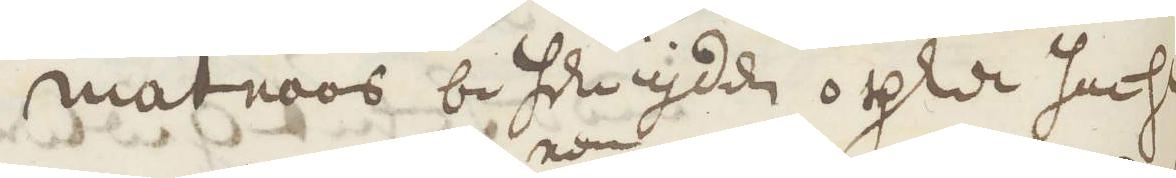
matroos bescheijden op het Jach
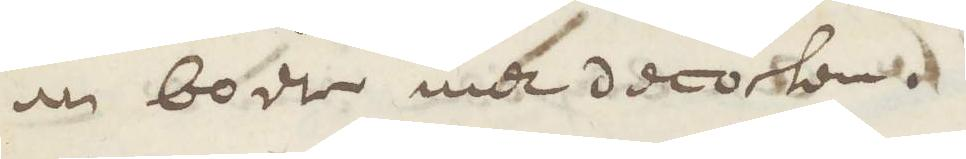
en boven met decosten.
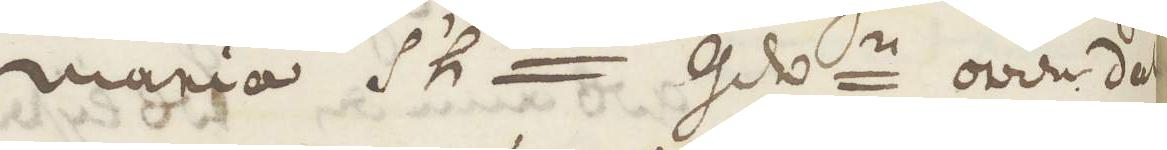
maria s'h=ren gev=n over de
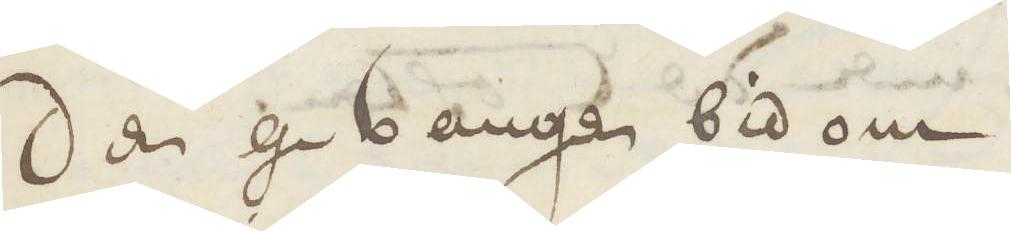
den gevangen bid om
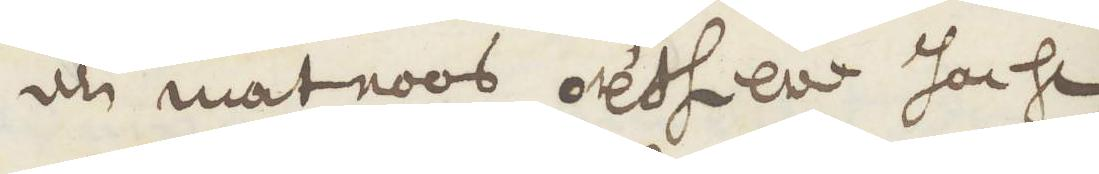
en matroos optselve Jacht
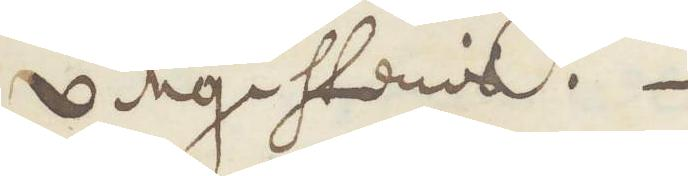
vergiffenis. -
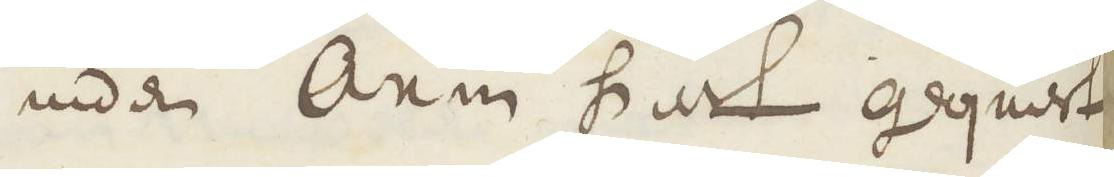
inden Arm heel gequest
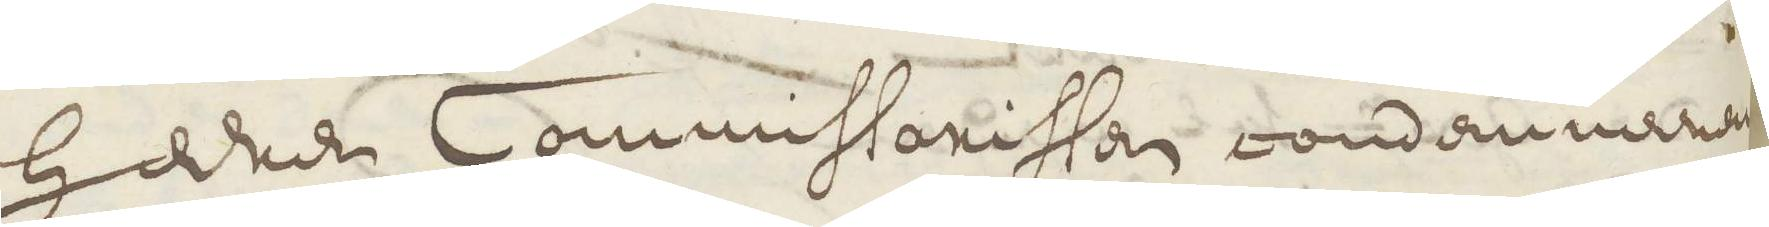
heeren Commissarissen condemneeren
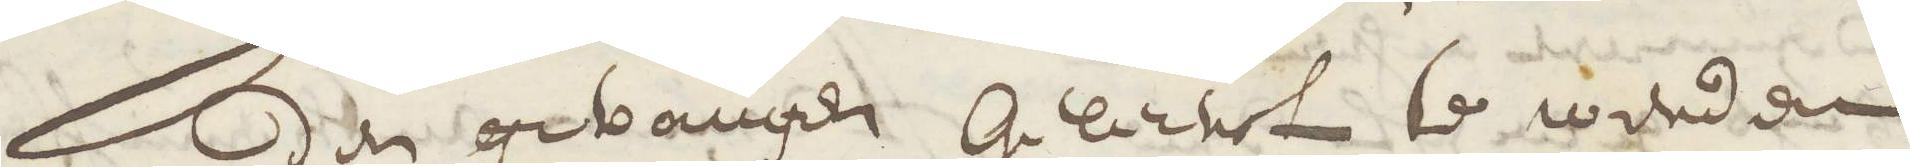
den gevangen geleerst te werden
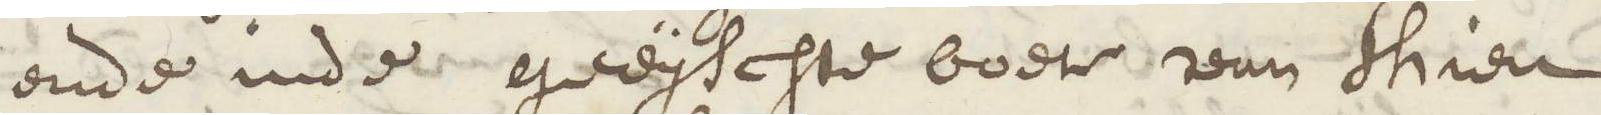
ende inde geeijschte boete van thien
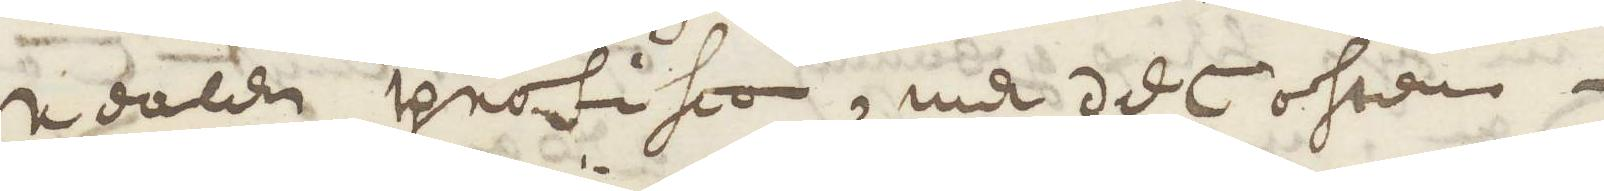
realen profisco met de Costen -
